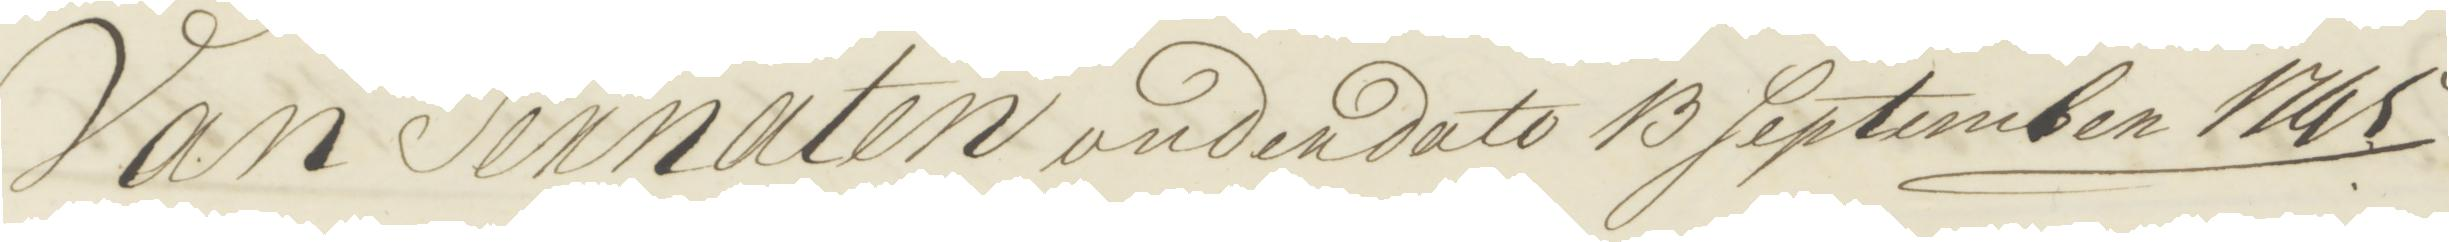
Van Ternaten onder dato 13 september 1745
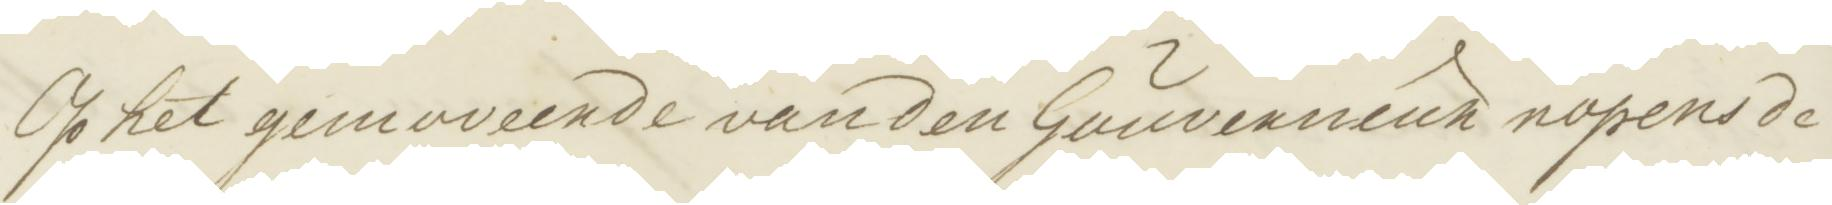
Op het gemoveerde van den Gouverneur nopens de
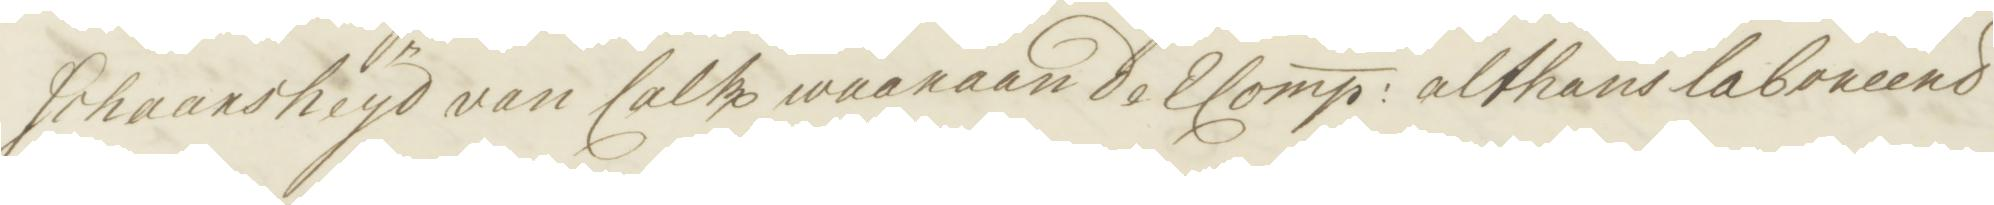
schaarsheijd van Calk waaraan de E Comp: althans laboreerd
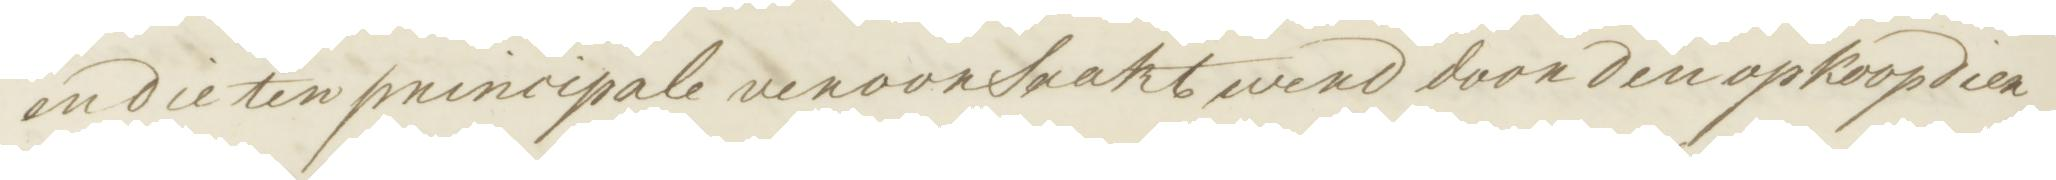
en die ten principale veroorsaakt werd door den opkoop dier
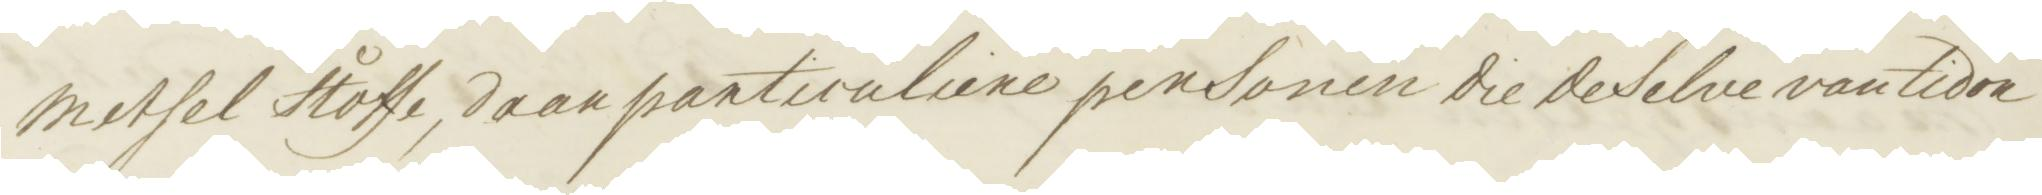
metsel stoffe, daar particuliere personen die deselve van tidor
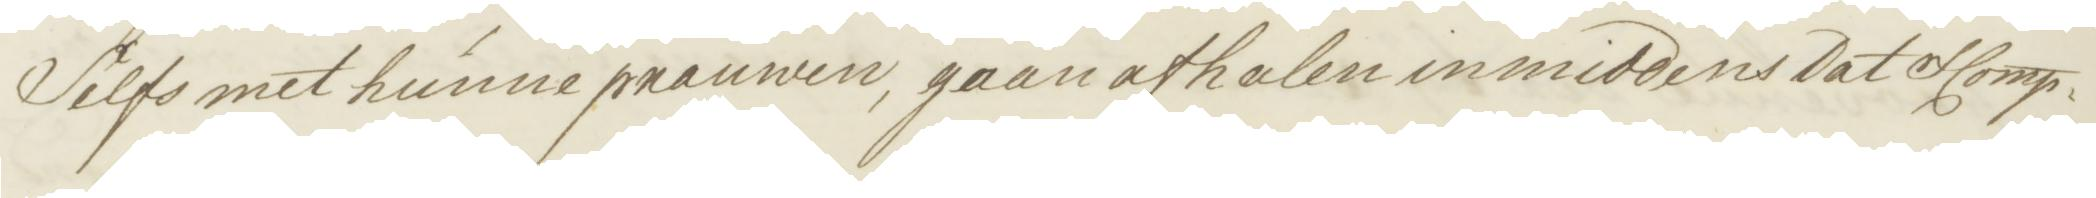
Selfs met hunne prauwen, gaan afhalen in middens dat SComp:
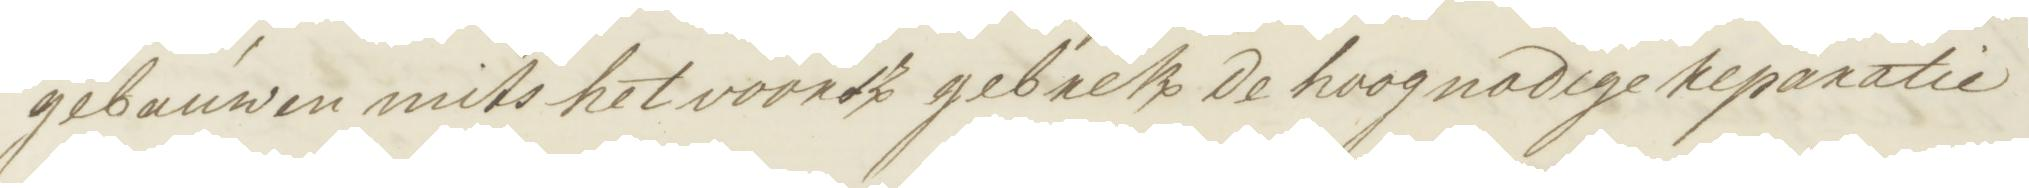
gebauw en mits het voorsz gebrek de hoog nodige reparatie
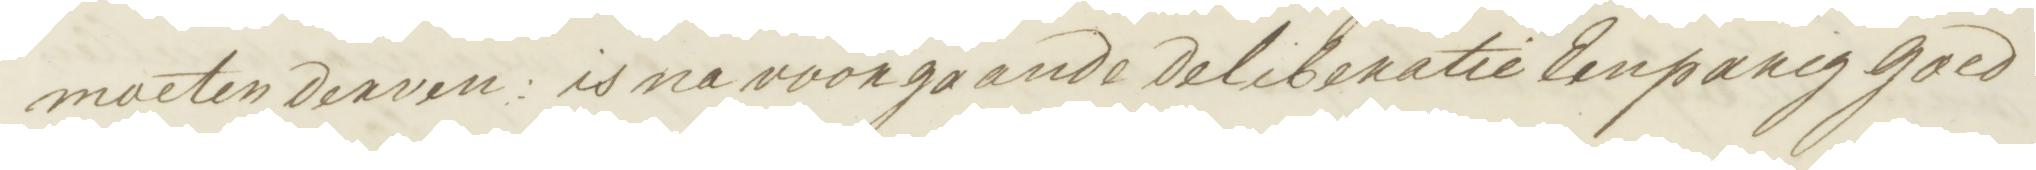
moeten derven: is na voorgaande deliberatie Eenparig goed
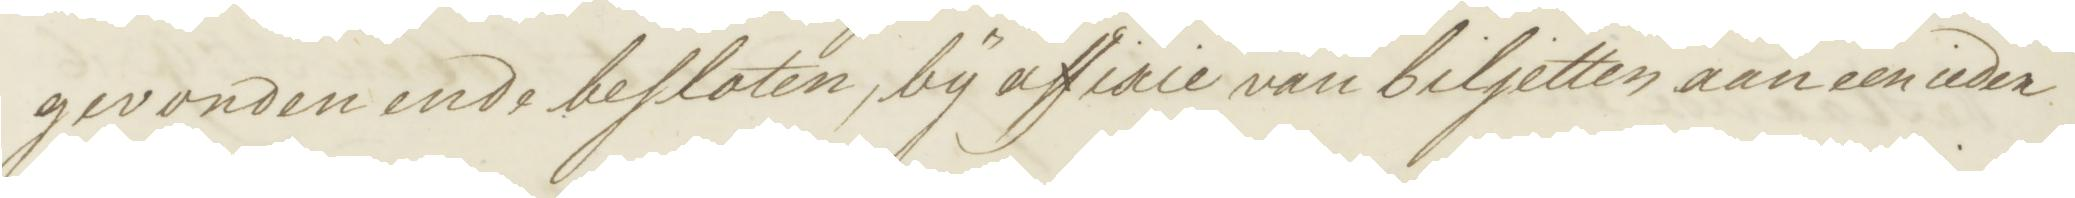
gevonden ende besloten, bij affixie van biljetten aan een ieder
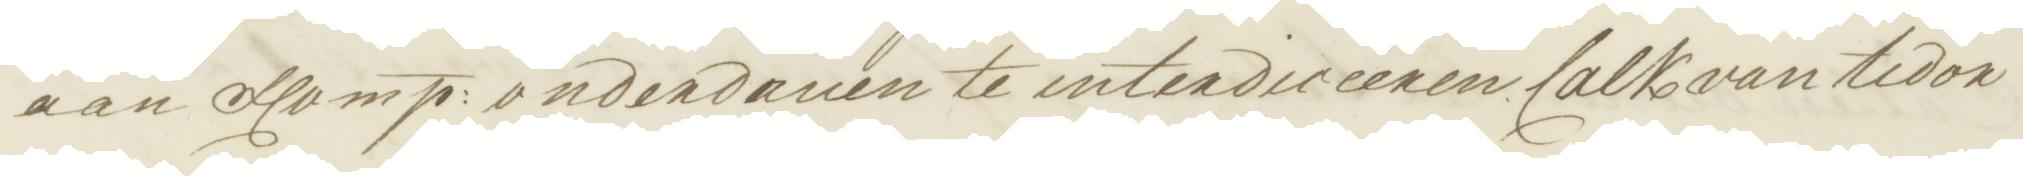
aan SComp: onderdanen te interdiceeren Calk van tidor
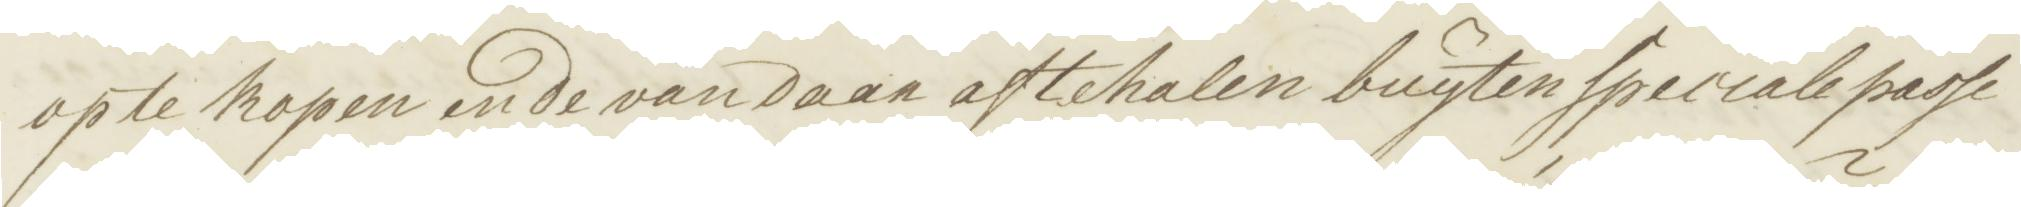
op te kopen in de van daar aftehalen buyten speciale passe
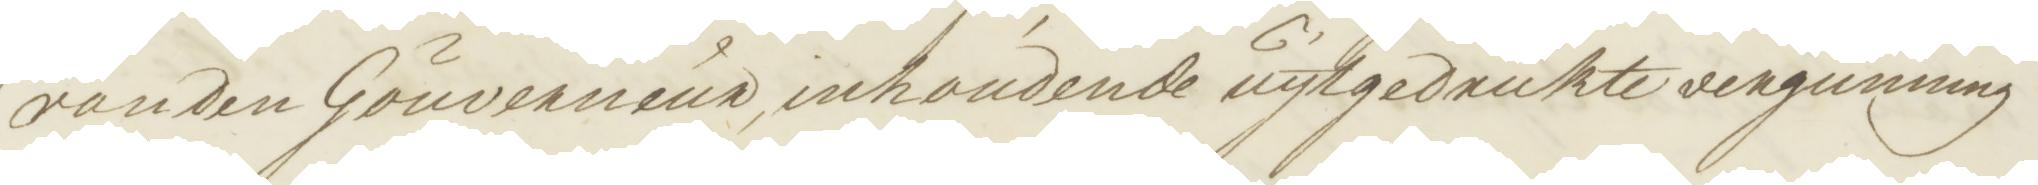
van den Gouverneur, inhoudende uijtgedrukte vergunning
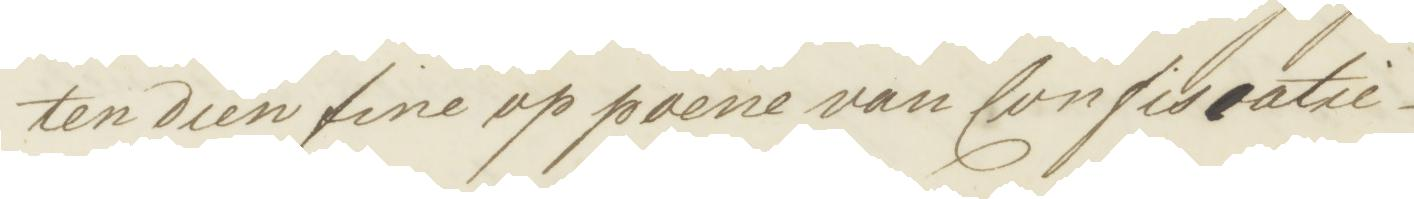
ten dien fine op poene van Confiscatie
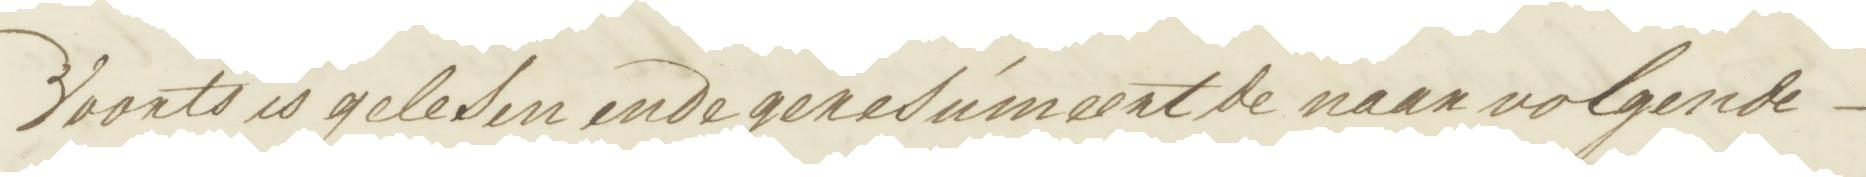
Voorts is gelesen ende geresumeert de naar volgende
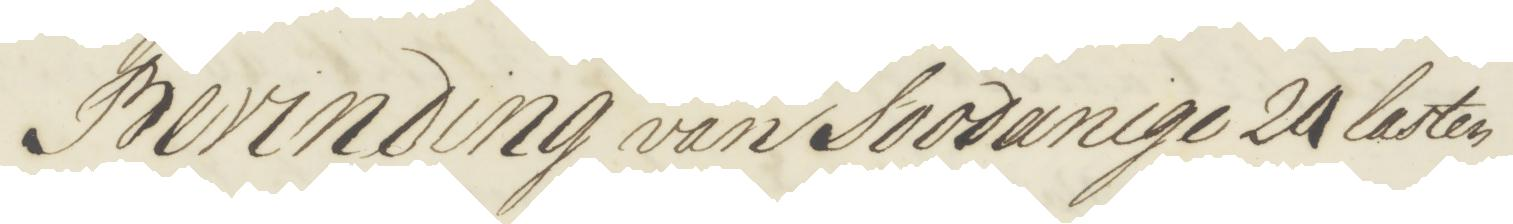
Bevinding van Soodanige 24 lasten
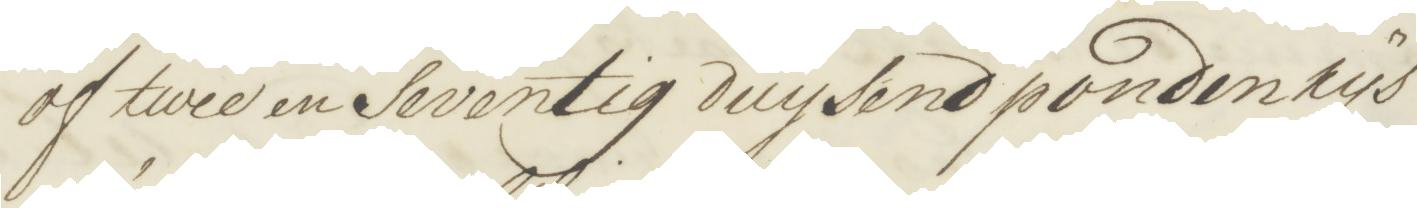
of twee en seventig duijsend ponden rijs
